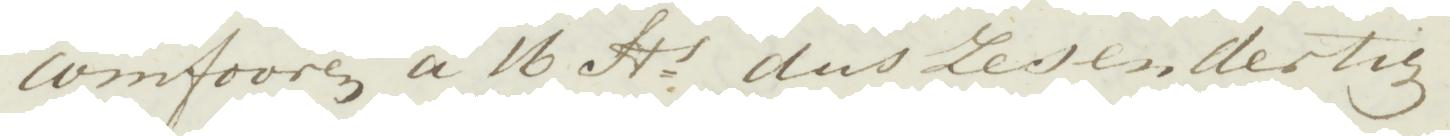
comfooren a 16 st=s dus zesendertig
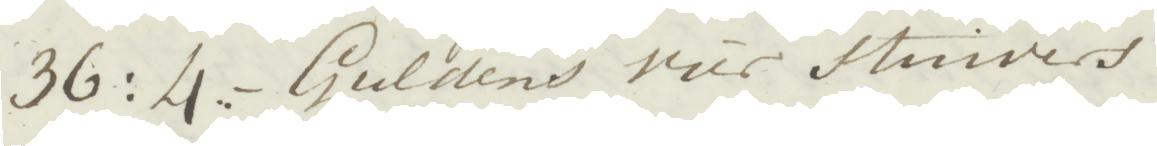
36: 4.- Guldens vier stuivers
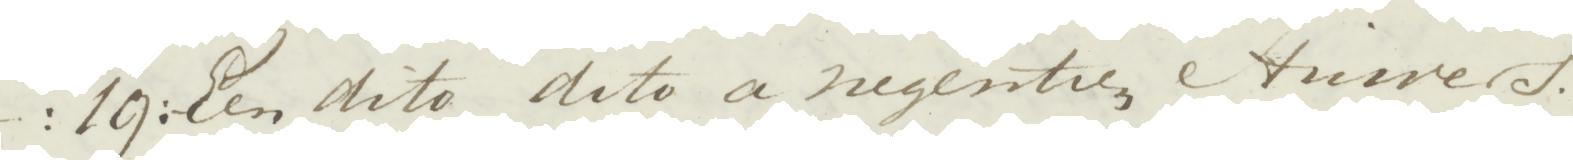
- : 19. Een dito dito a negentien Stuivers.
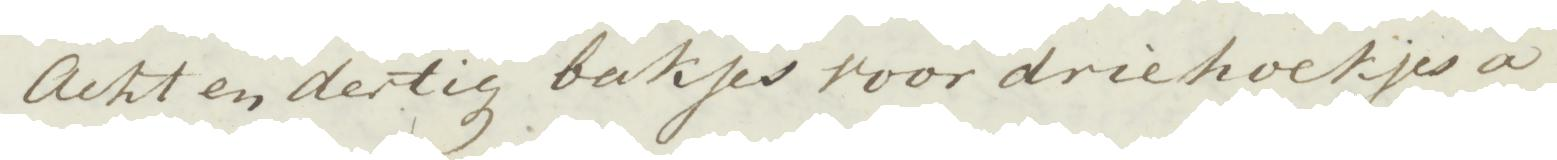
Acht en dertig bakjes voor driehoekjes a
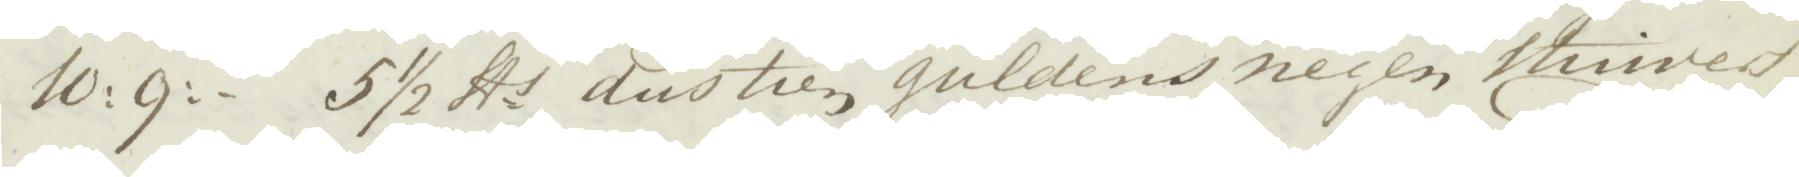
10: 9: - 5½ st=s dus tien guldens negen stuivers
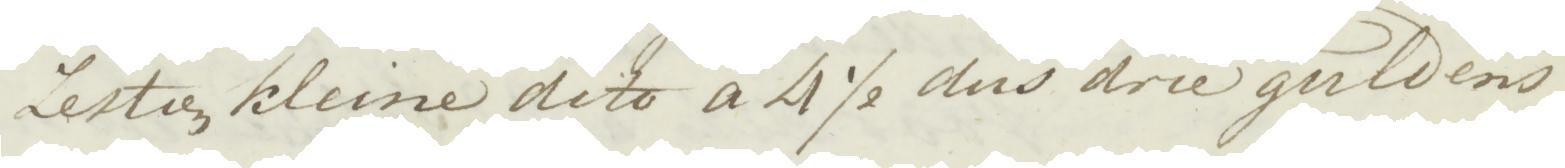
zestien kleine dito a 4½ dus drie guldens
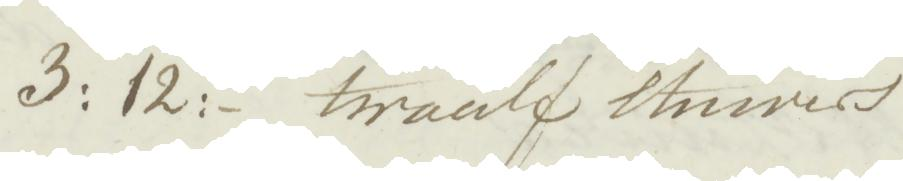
3: 12:- twaalf stuivers
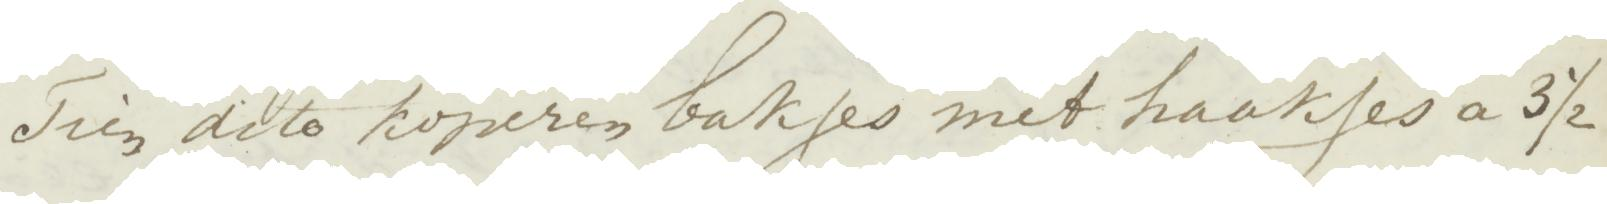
Tien dito koperen bakjes met haakjes al 3½
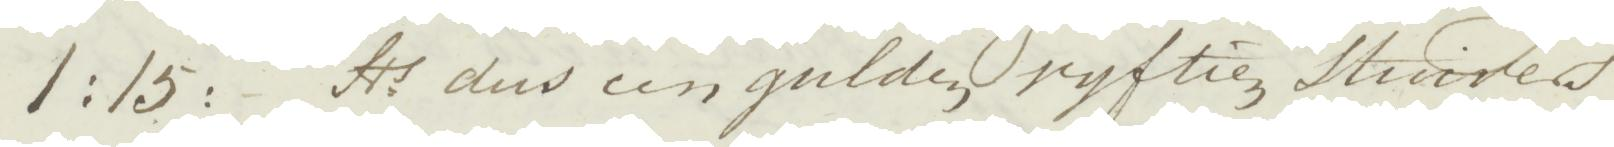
1: 15 : - st=s dus een gulden vijftien stuivers
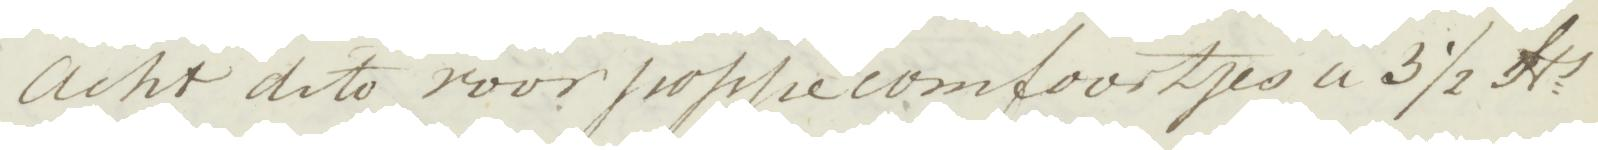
Acht dito voor poppecomfoortjes a 3½ st:s
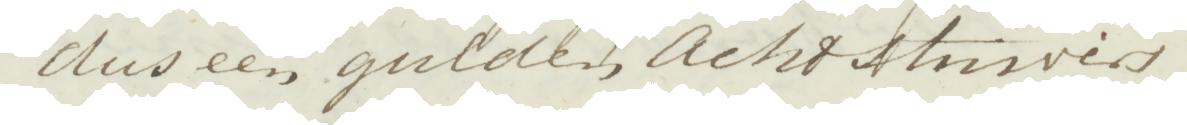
dus een gulden Acht stuivers
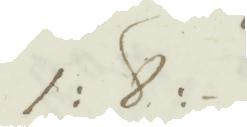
1: 8 : -
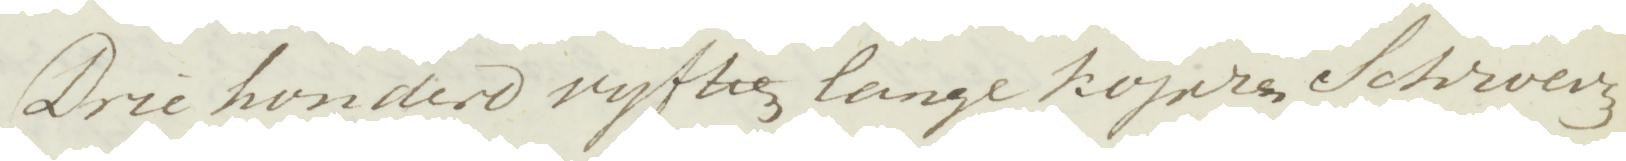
Drie honderd vijftien lange koperen schroeven
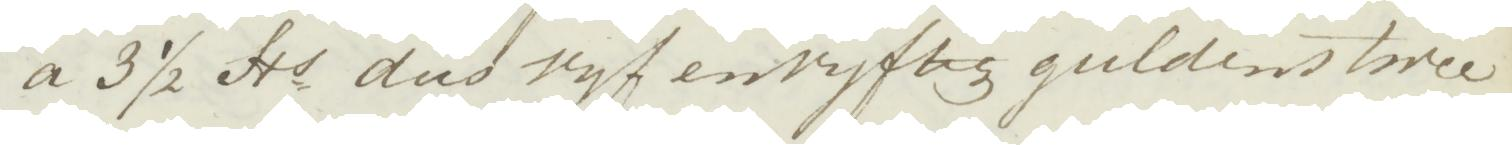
a 3½ st=s dus vyf en vyftig guldens twee
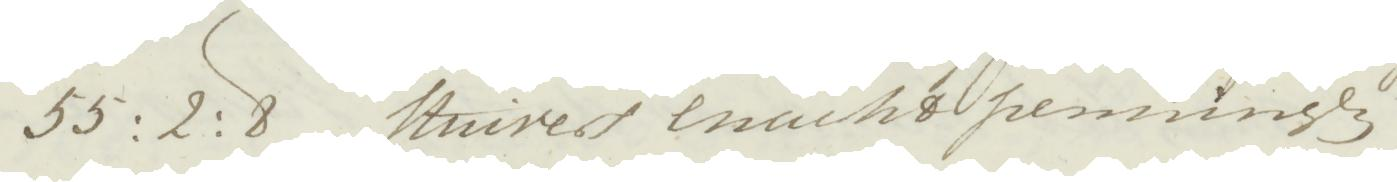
55 : 2: 8 stuivers enacht penningen
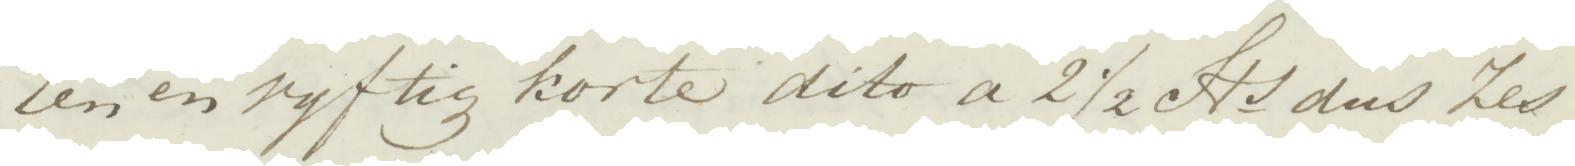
een en vyftig korte dito a 2½ sts dus zes
